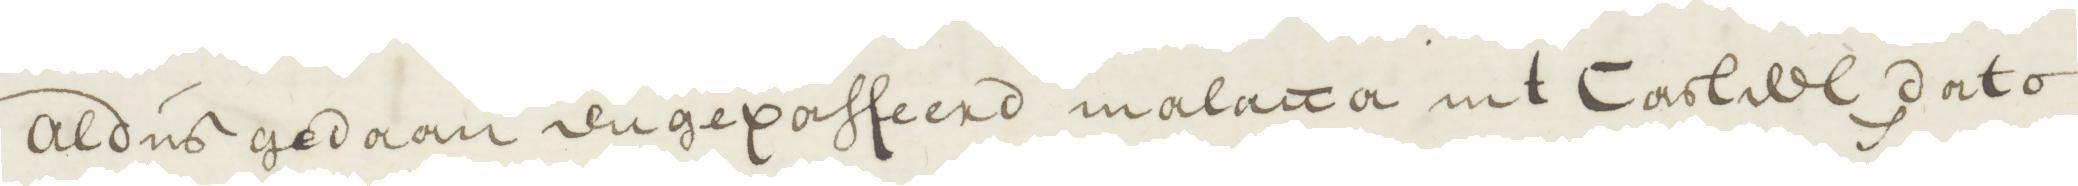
aldus gedaan en gepasseerd malacca in 't Casteel dato
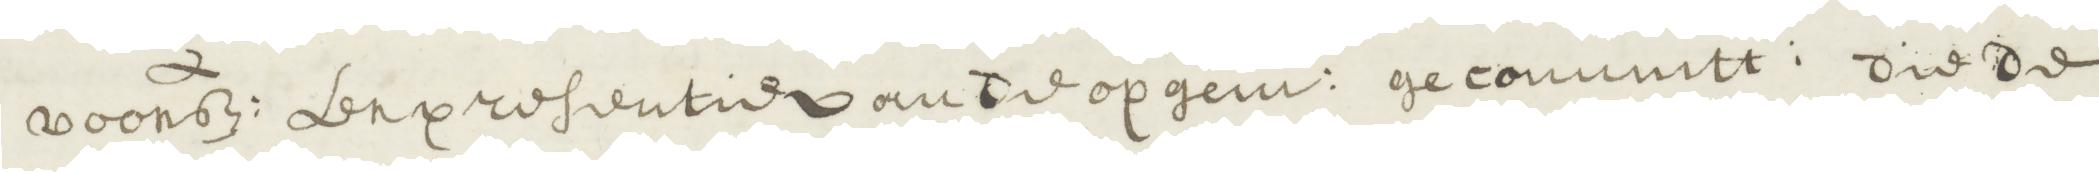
voors: ter presentie van de opgem:' gecommitt: die de
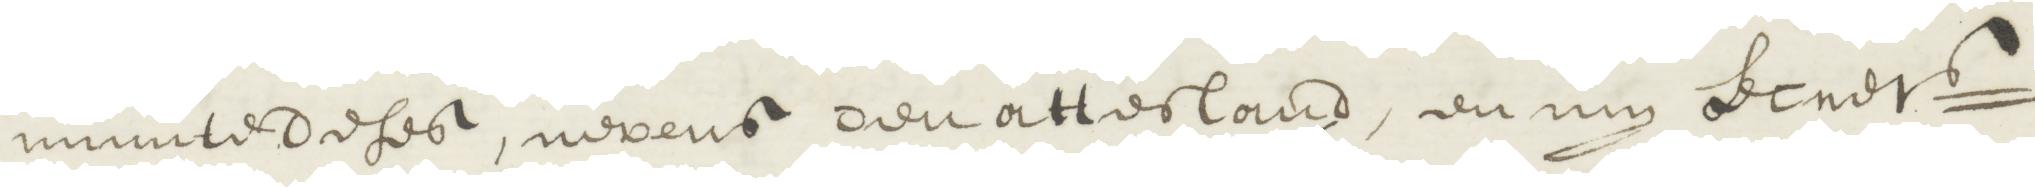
minute deses, nevens den attestand, en my secret=s
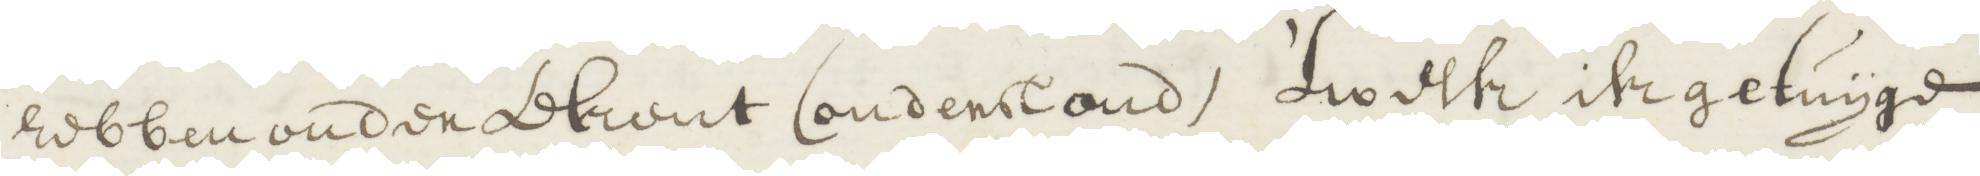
hebben ondertekent (onderstond) 'twelk ik getuijge
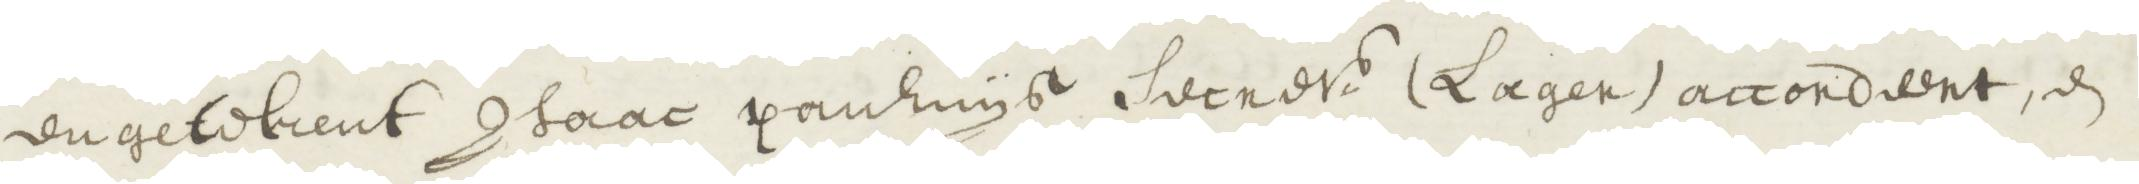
en getekent jsaac panhuijs secret-s (Lager) accordeert, en
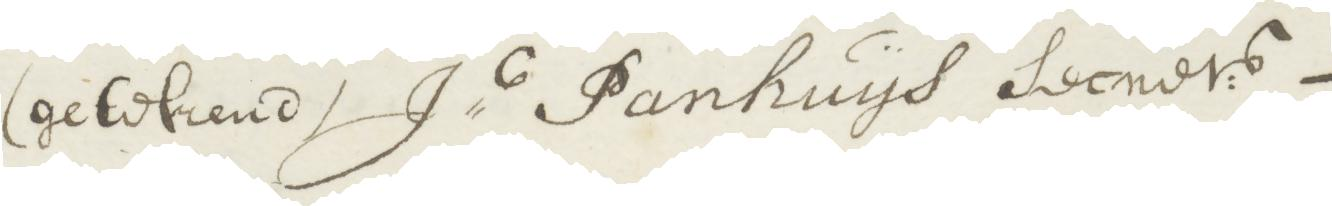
(getekend) J„s Panhuijs secret:s —
